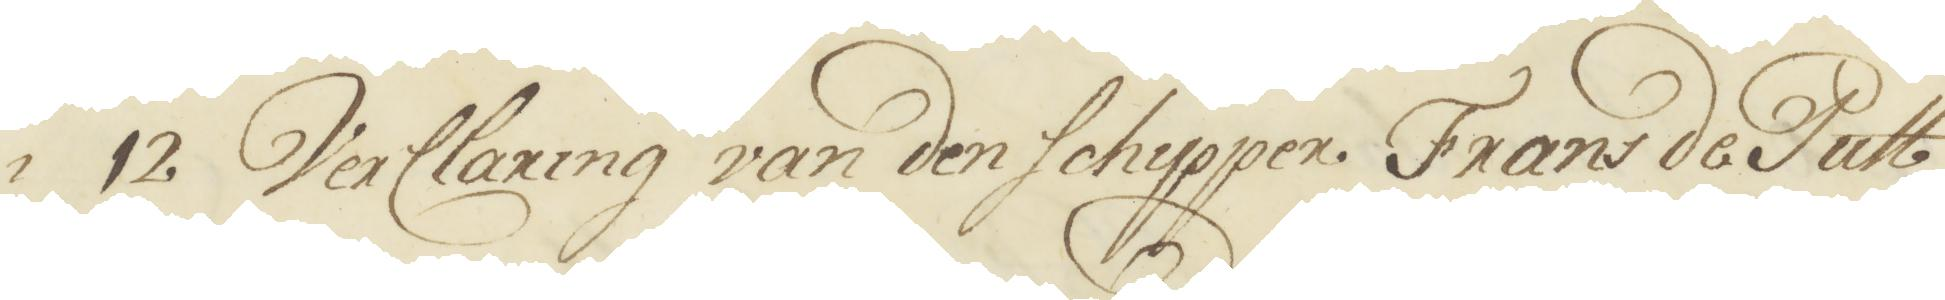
12 Verclaring van den schipper Frans de Putt
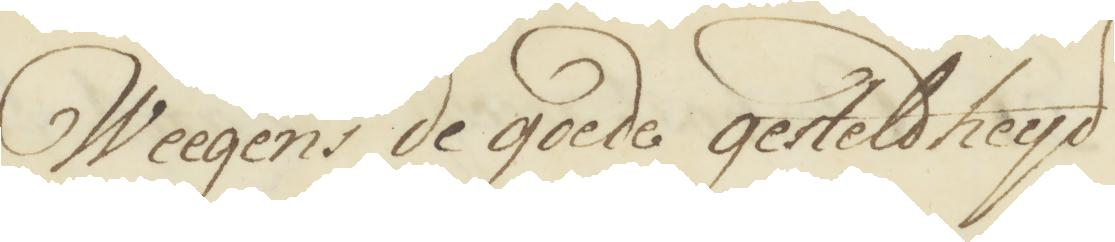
Weegens de goede gesteldheyd
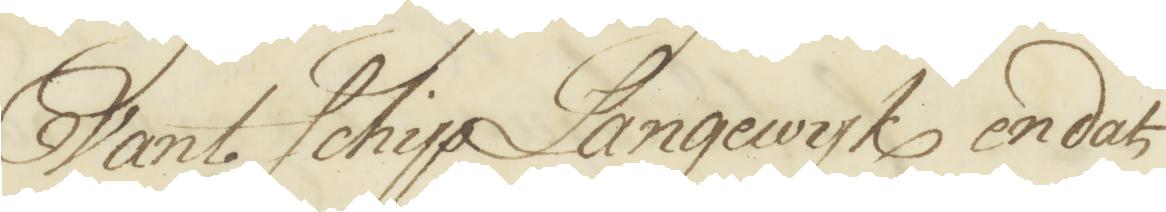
Van t schip Langewyk en dat
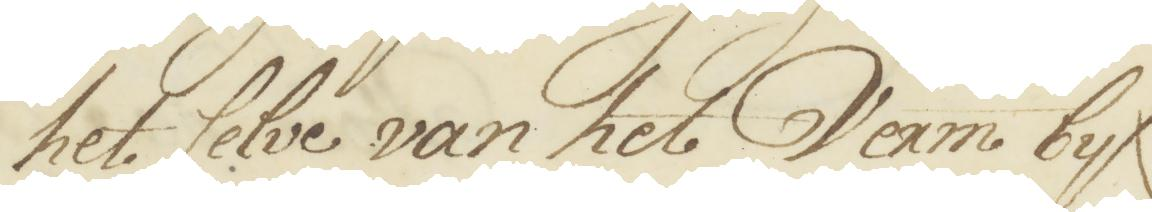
het selve van het Verm by
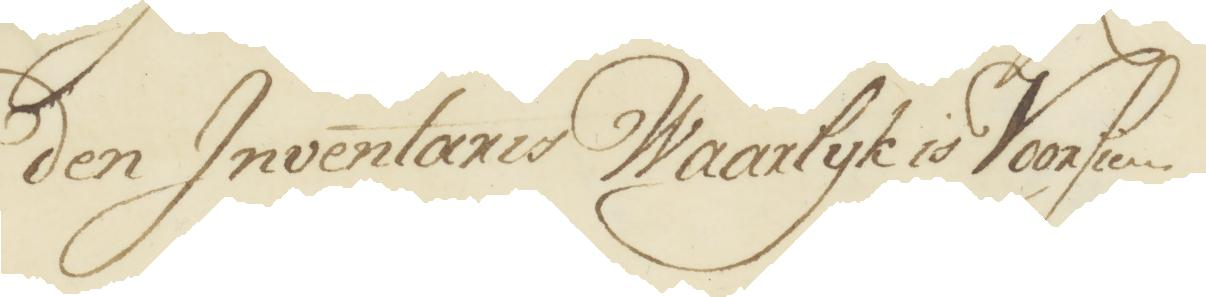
den Jnventaris Waarlyk is Voorsien
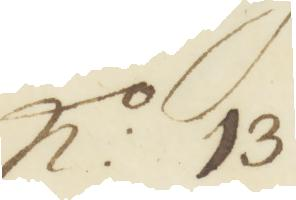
n:o 13
